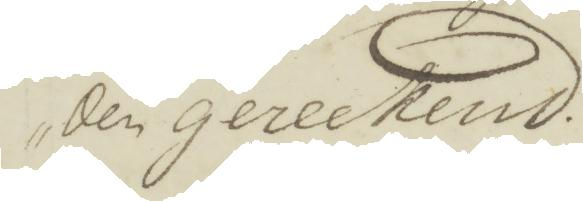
„den gereekend.
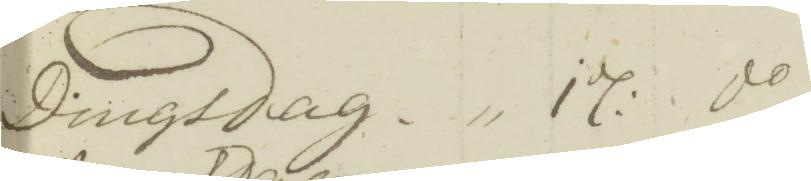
Dingsdag - „ 17: do
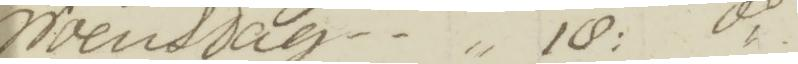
Woensdag - - „ 18: d„o
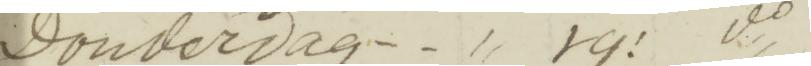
Donderdag - - „ 19: d„o
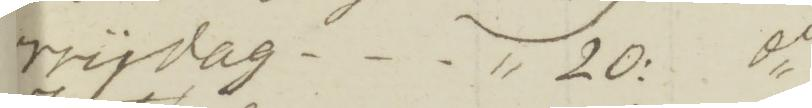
Vrijdag - - - „ 20: d„o
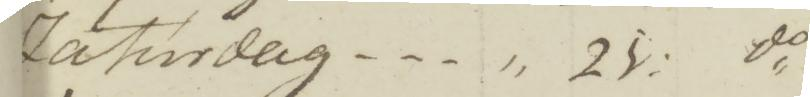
Zaturdag - - - „ 25: d„o
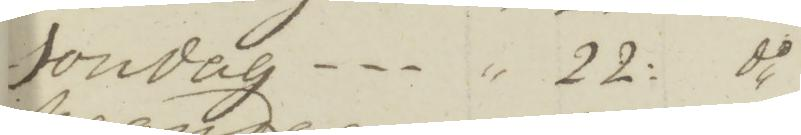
Sondag - - - „ 22: d„o
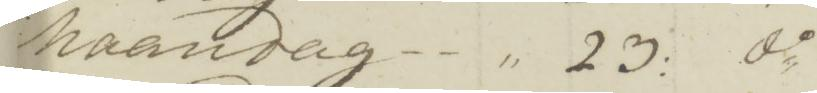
Maandag - - „ 23: d„o
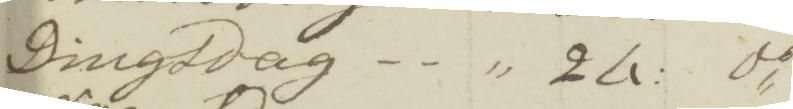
Dingsdag - - „ 24: d„o
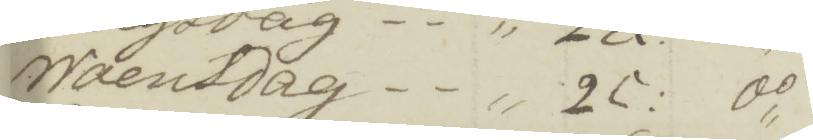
Woensdag - - „ 25: d„o
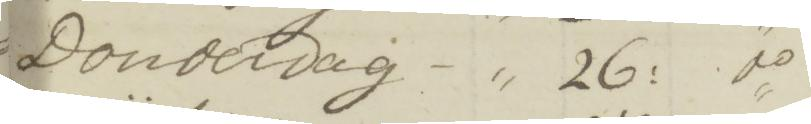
Donderdag - „ 26: d„o
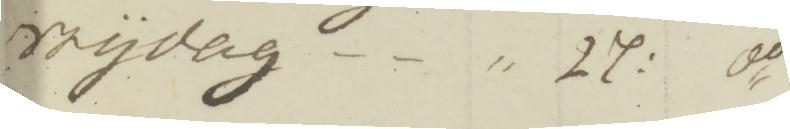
Vrijdag - - „ 27: d„o
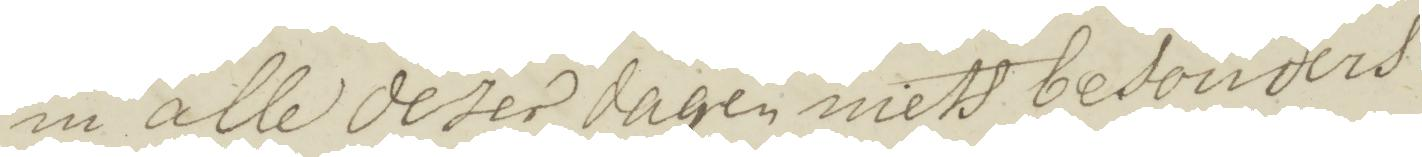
in alle dezer dagen niets besonders
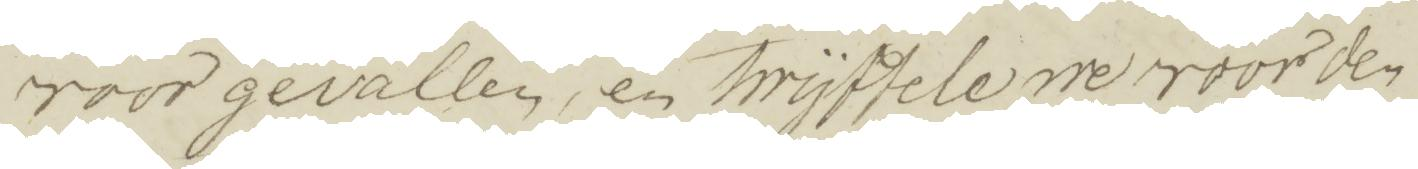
voor gevallen, en twijffele we voor den
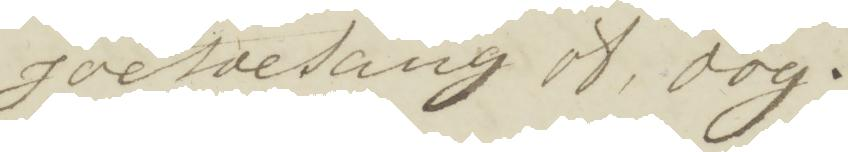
joetoesang of, dog.
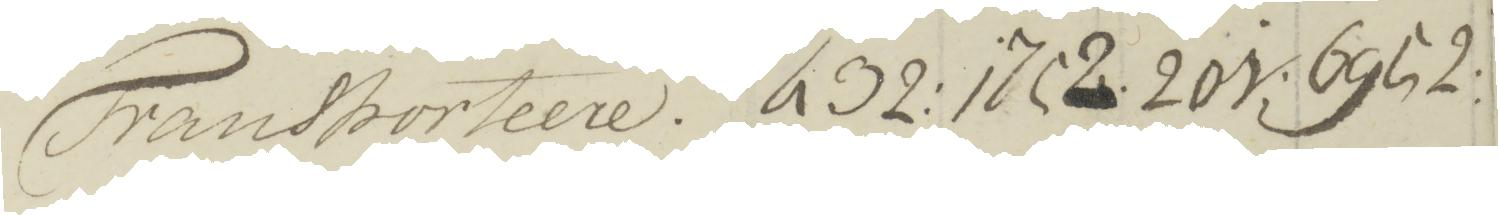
Transporteere. 432: 1752: 201: 6952:
